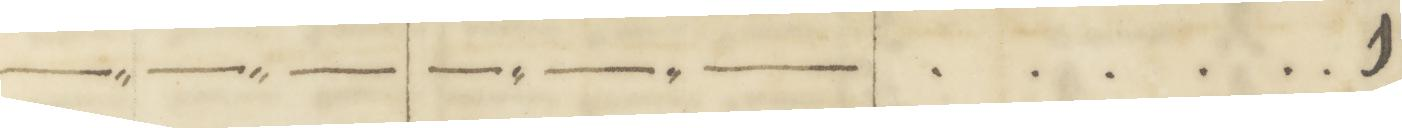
—„ —„ — —„ —„ — . . . . . . 1
